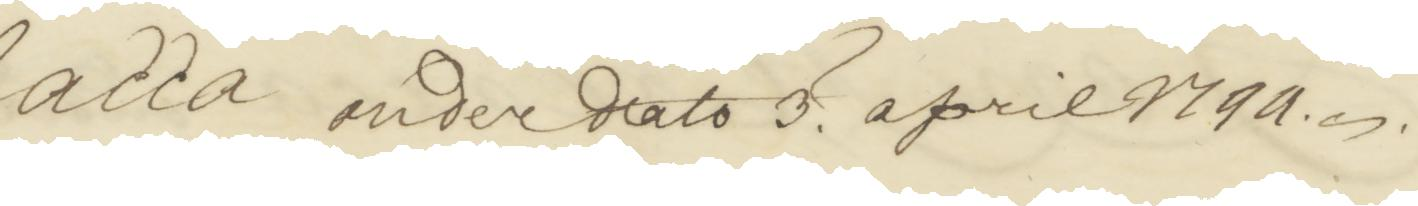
Van Malacca onder dato 3.' april 1744.
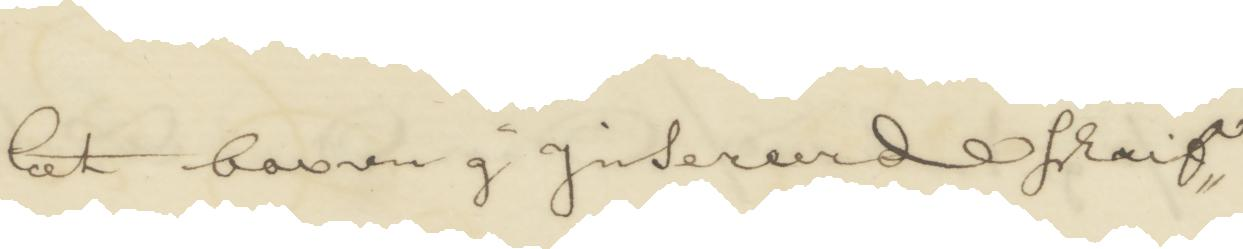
het boven g’ Jnsereerde schrif„
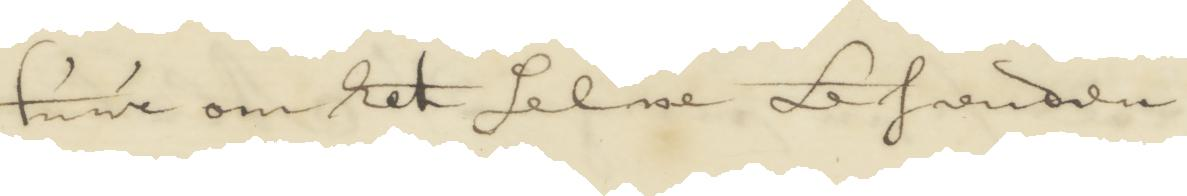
tuur om het selve te senden
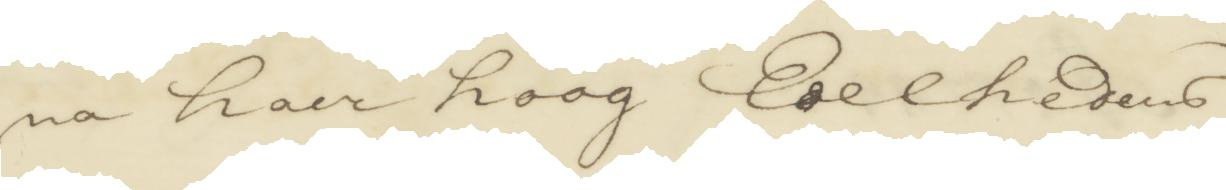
na haer hoog Edelhedens
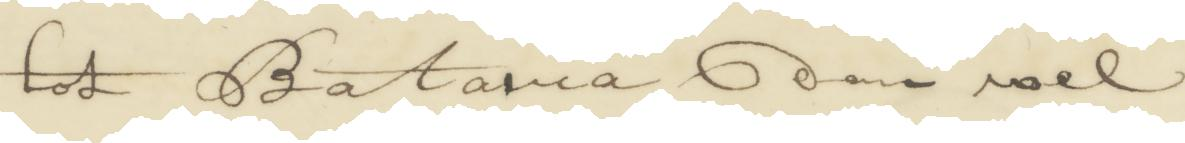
tot Batavia dan wel
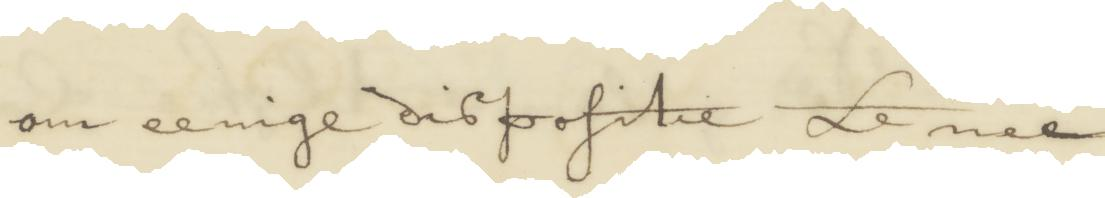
om eenige dispositie te nee
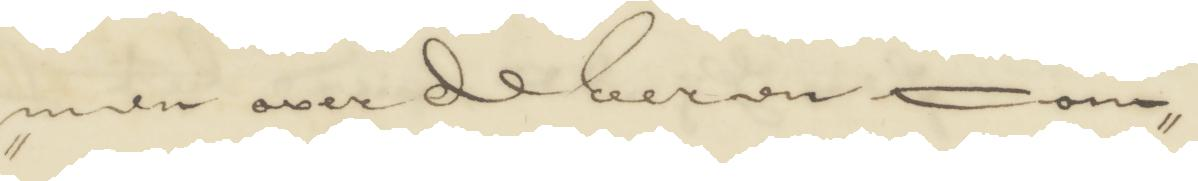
men over de heeren com„
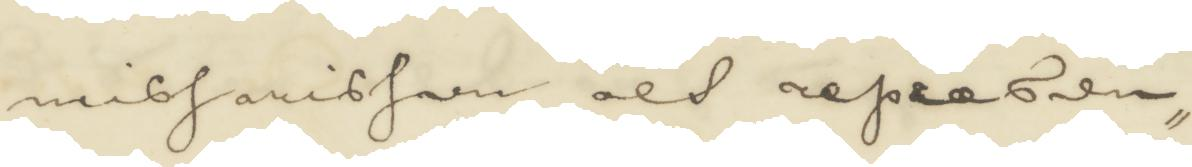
missarissen als repraesen„
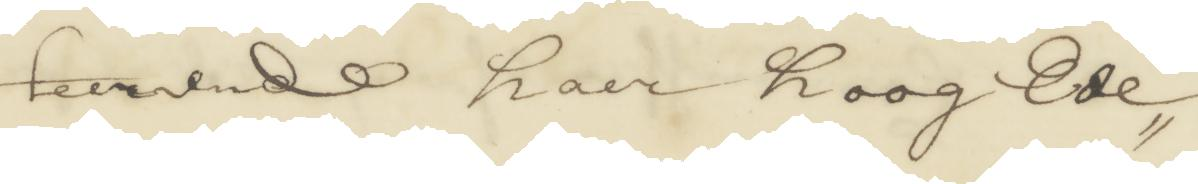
teerende haer hoog Ede„
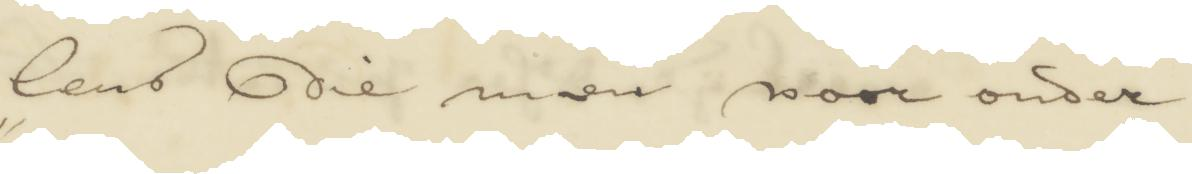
„lens die men voor onder
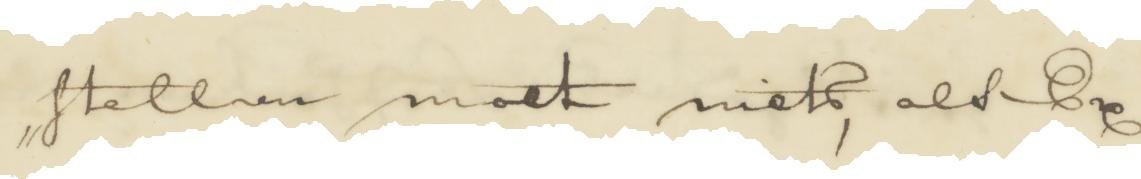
„stellen moet niets als Ex
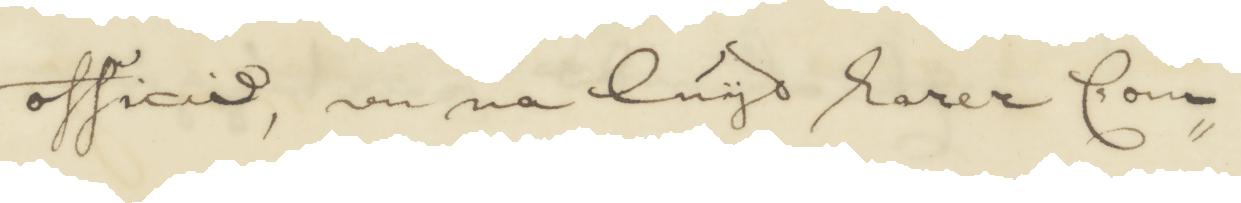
officie, en na luijd harer Com„
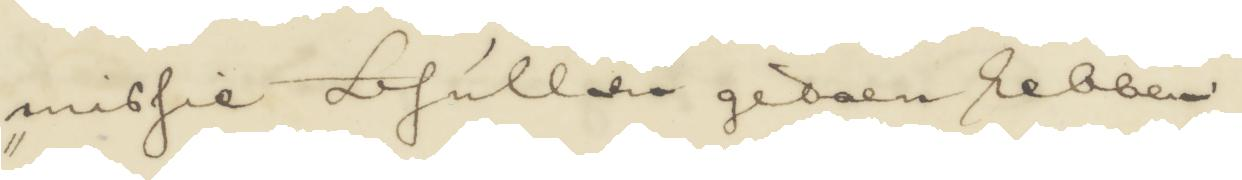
„missie tesullen gedaen hebben,
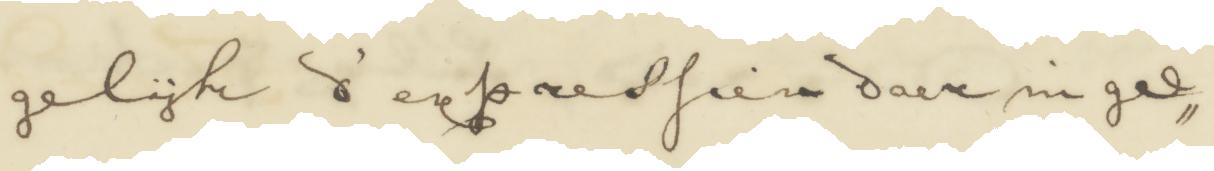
gelijk d' expressien daer in ge„
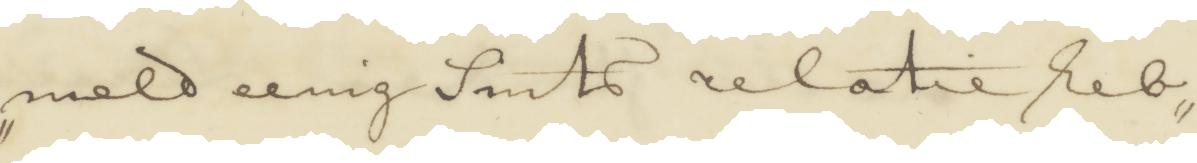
„meld eenig sints relatie heb„
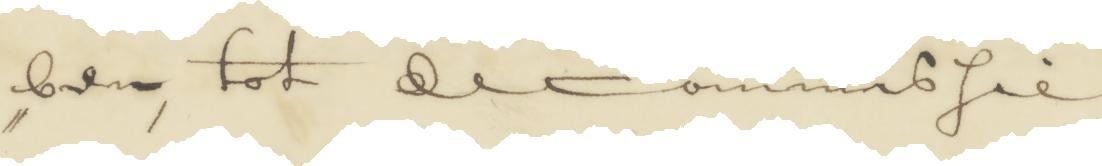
ben, tot de commissie
